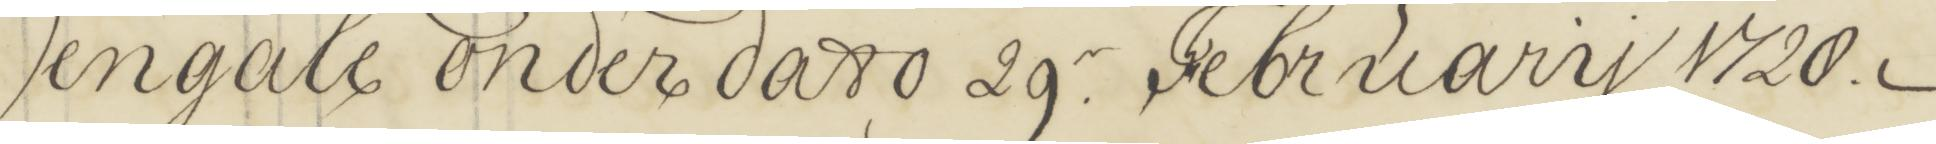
Van Bengale onder dato 29.' Februari 1728.
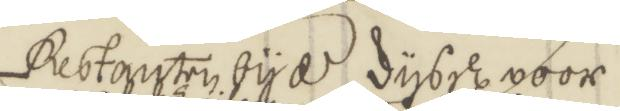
Restanten bij de Eijsch voor
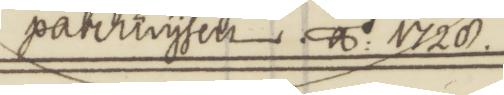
pakhuijsen. a:o 1728.
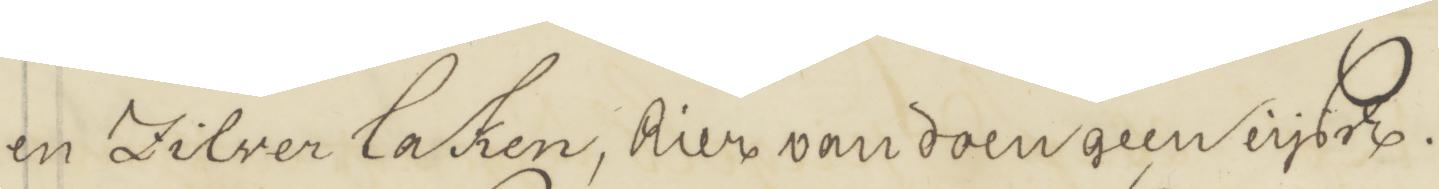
en zilver laken, hier van doen geen eijsch.
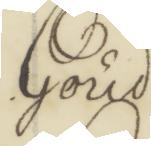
Goud
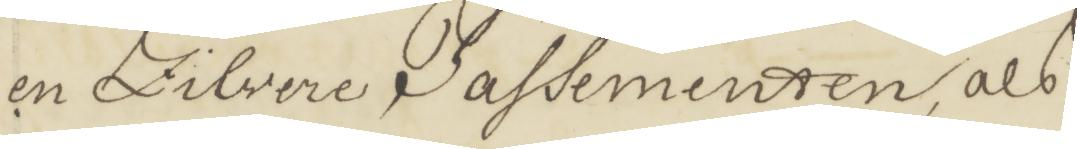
en Zilvere Passementen, als
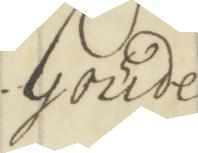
Goude
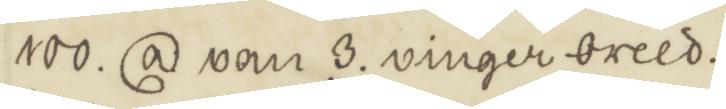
100. @ van 3. vinger breed.
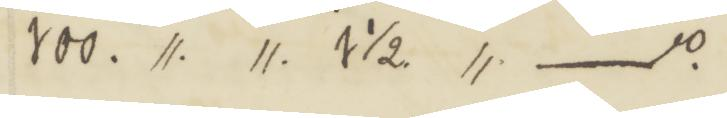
100. „. „. 1½. „. _.o
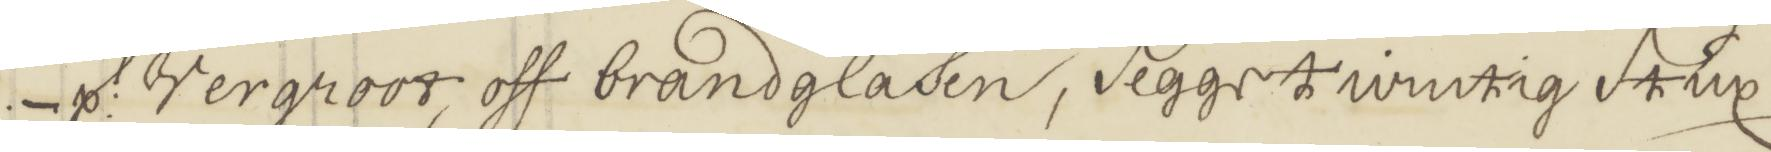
–. p:s vergroot off brandglasen, segge twintig stux
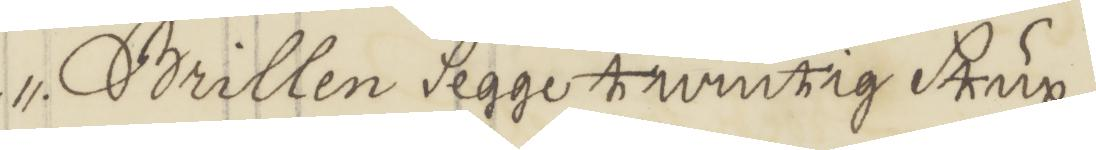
„. Brillen segge twintig stux.
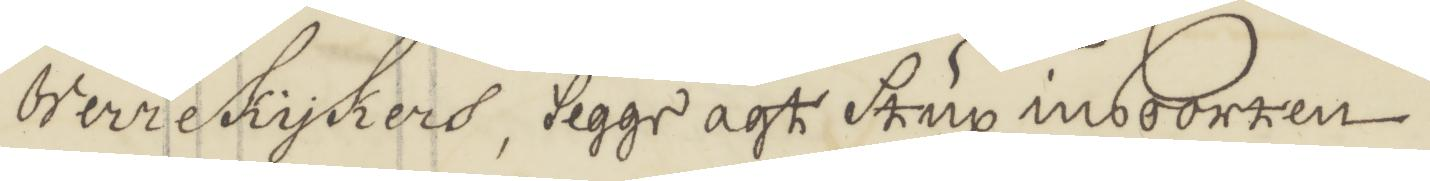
verrekijkers, segge agt stux insoorten.
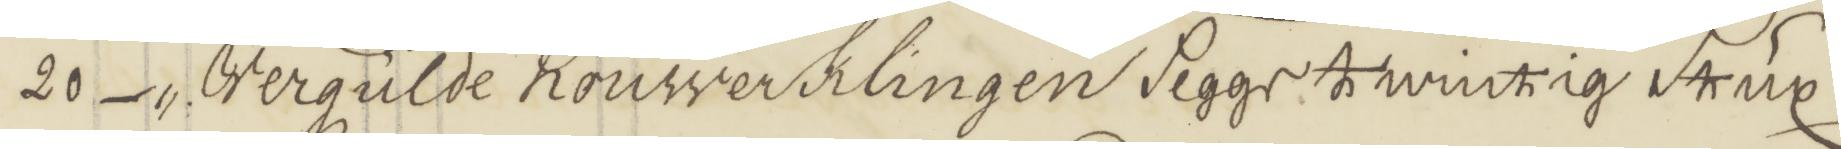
20 – „. vergulde houwerklingen segge twintig stux.
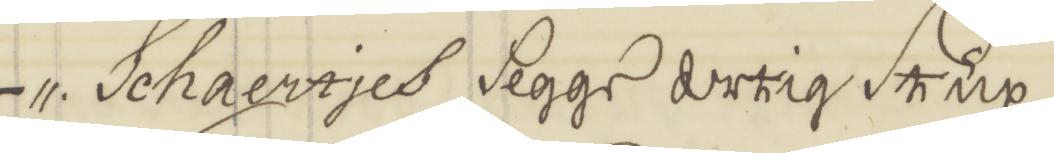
„ . schaertjes segge dertig stux.
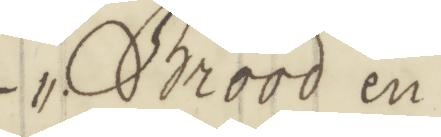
„. Brood en
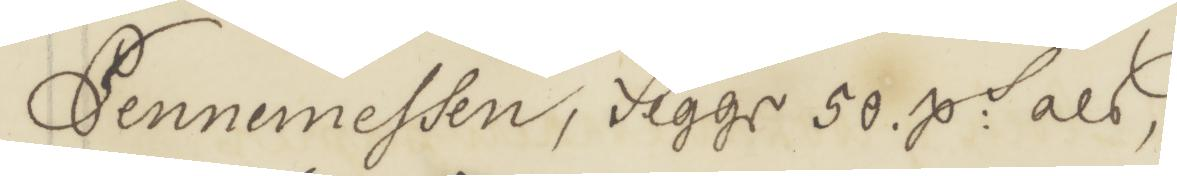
Pennemessen, segge 50. p:s als,
